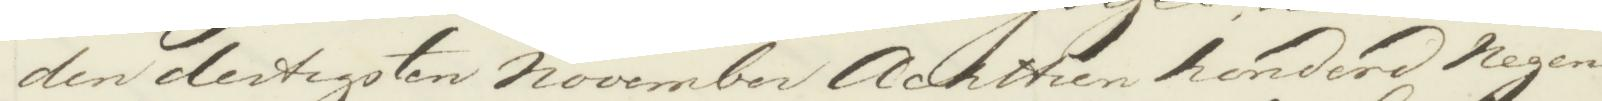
den dertigsten November Achttien honderd Negen
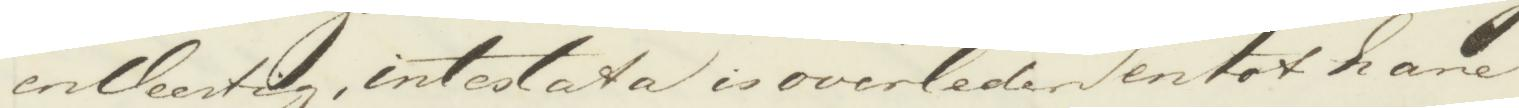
en Veertig, intestata is overleden en tot hare
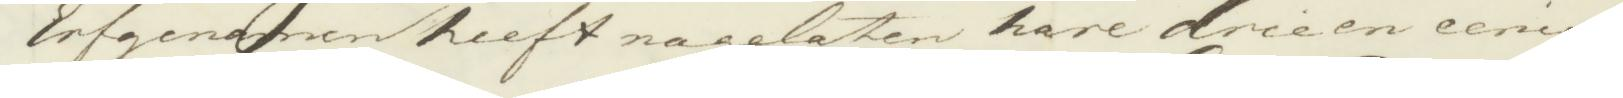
Erfgenamen heeft nagelaten hare drie en eenige
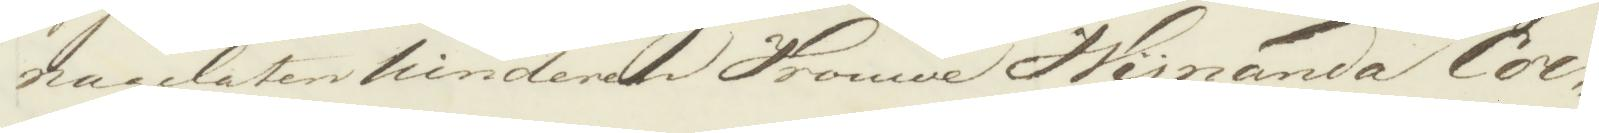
nagelaten kinderen Vrouwe Wijnanda Cor„
